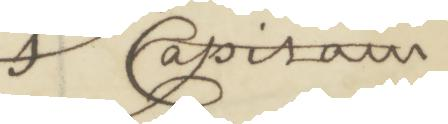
1 Capitain
